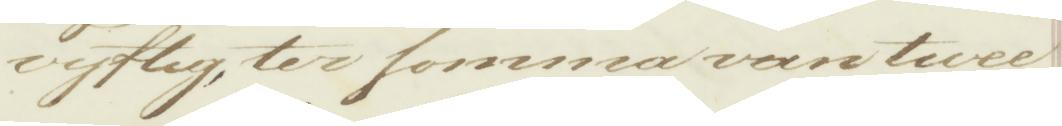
vijftig, ter somma van twee
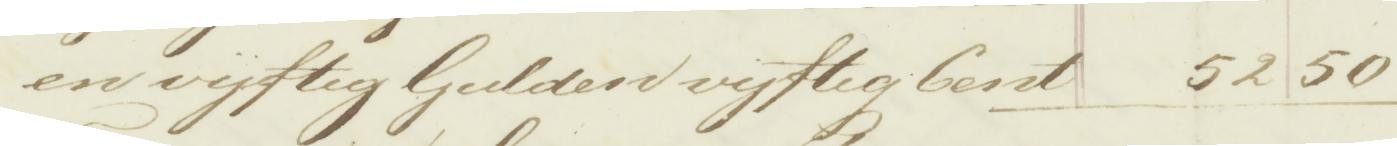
en vijftig Gulden vijftig Cent 52 50
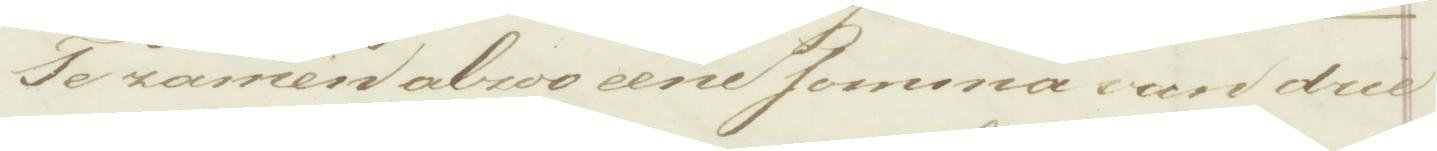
Te zamen alzoo eene somma van drie
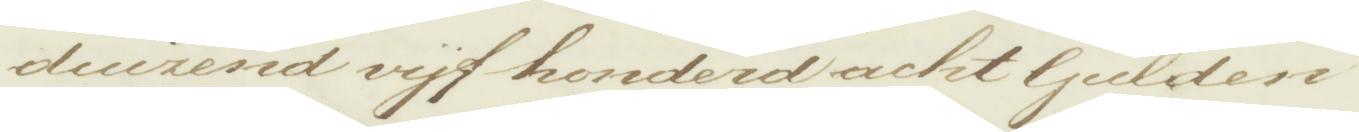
duizend vijf honderd acht Gulden
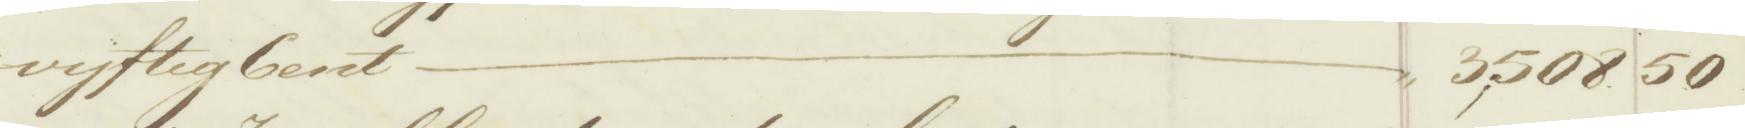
vijftig Cent —„ 3,508. 50
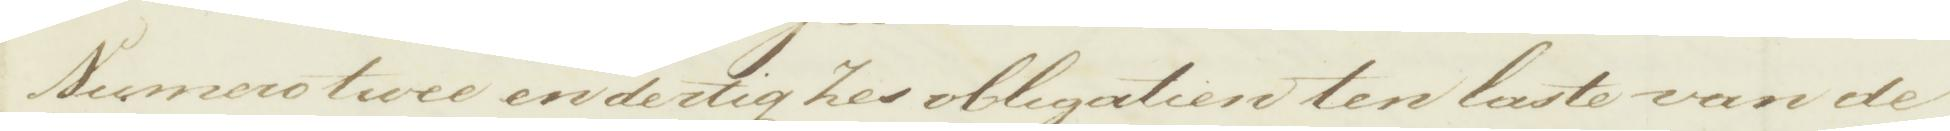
Numero twee en dertig Zes obligatien ten laste van de
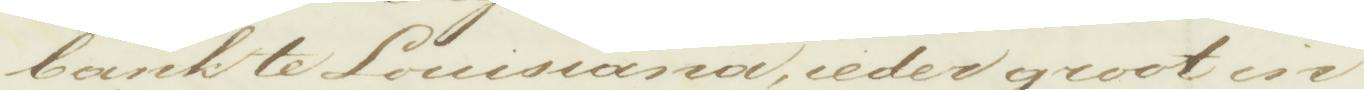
bank te Louisiana, ieder groot in
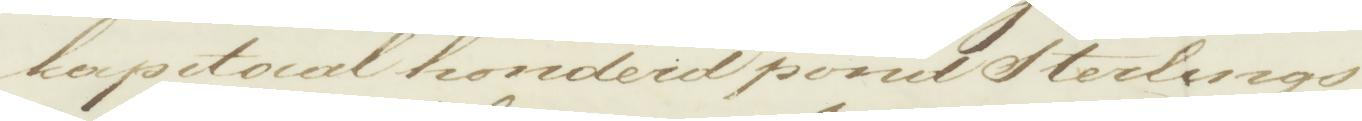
kapitaal honderd pond sterlings
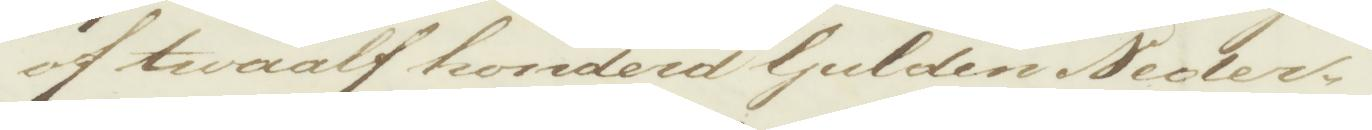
of twaalf honderd Gulden Neder„
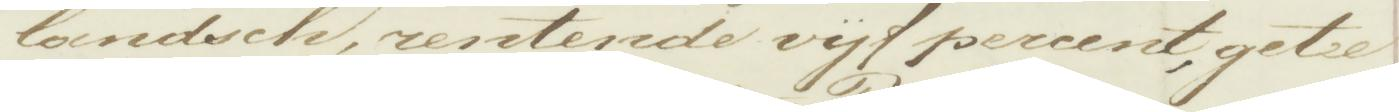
landsch, rentende vijf percent, getee
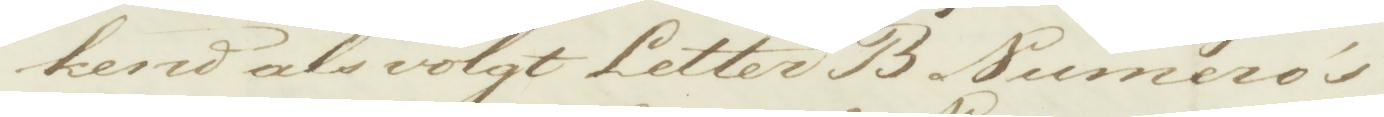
kend als volgt Letter B Numero's
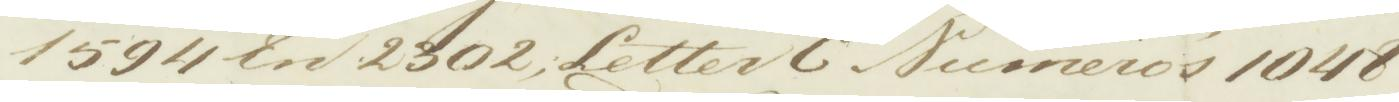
1594 En 2302; Letter C Numero's 1048
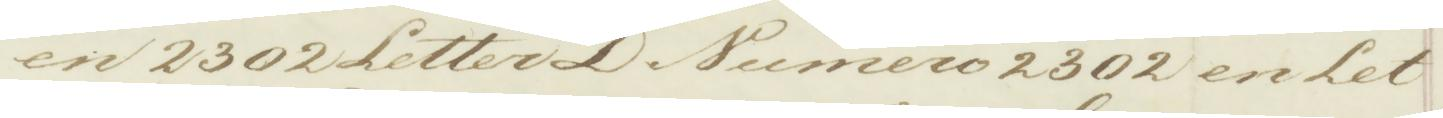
en 2302 Letter D Numero 2302 en Let
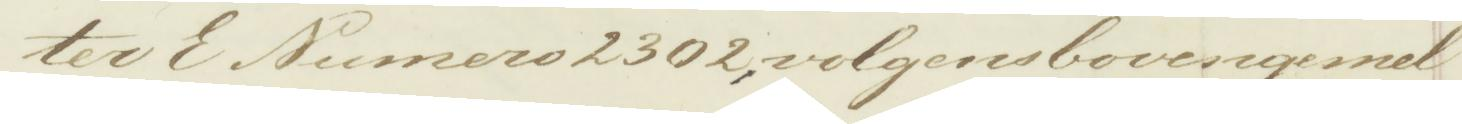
ter E Numero 2302, volgens bovengemel
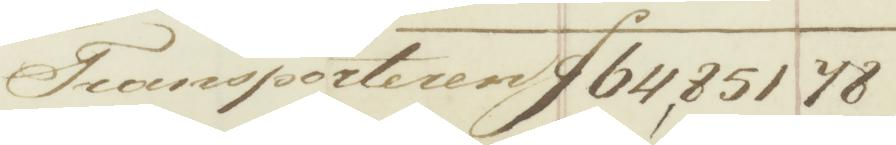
Transporteren ƒ64,851 78
